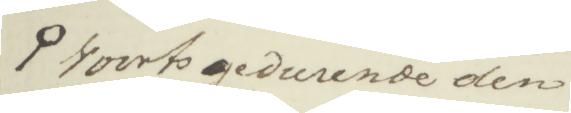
¶ Voorts gedurende den
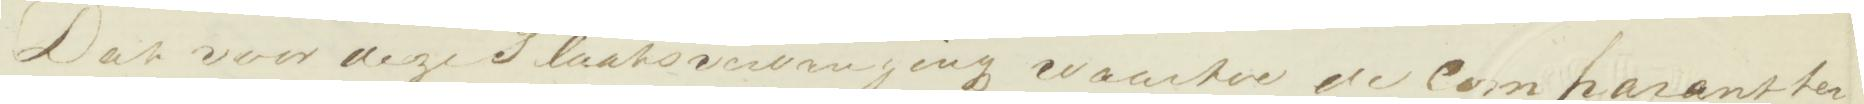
Dat voor deze Plaatsvervanging waartoe de Comparant ter
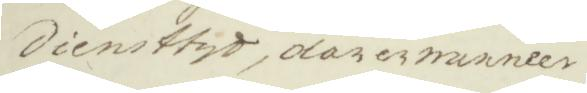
diensttijd, dan en wanneer
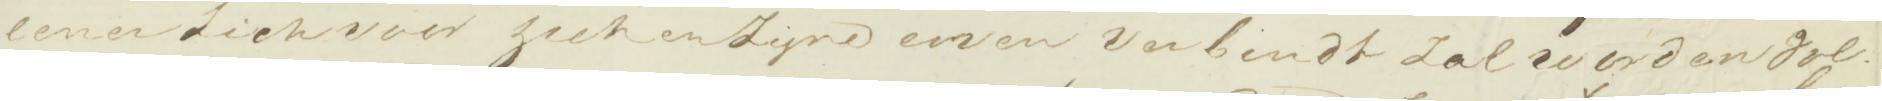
eener zich voor zich en zijne erven verbindt zal worden vol
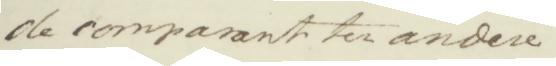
de comparant ter andere
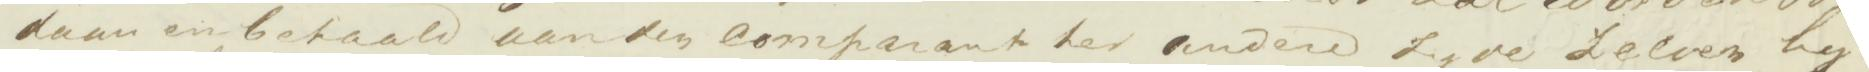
daan en betaald aan den comparant ter andere zyde zelven bij
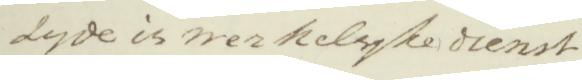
zyde in werkelyke dienst
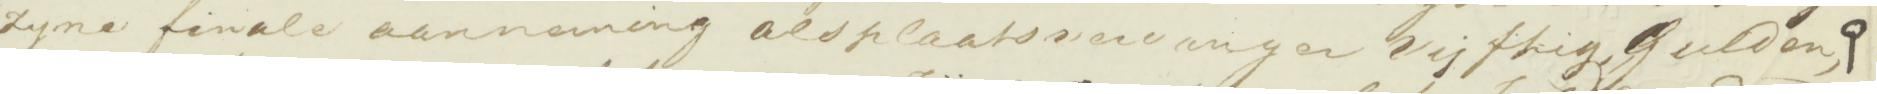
zyne finale aanneming als plaatsvervanger Vijftig, Guldens ¶
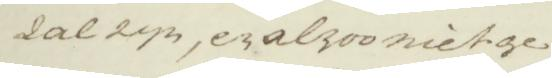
zal zyn, en alzoo niet ge
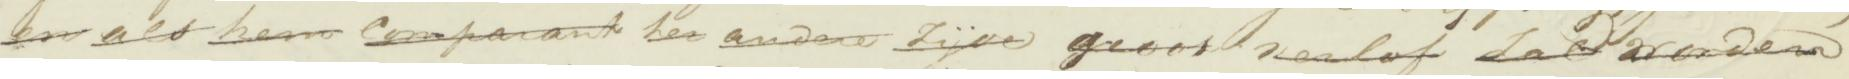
en als hem comparant ter andere zijde groot verlof zal worden
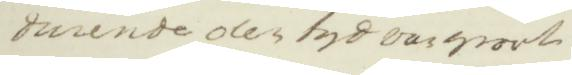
durende den tyd van groot
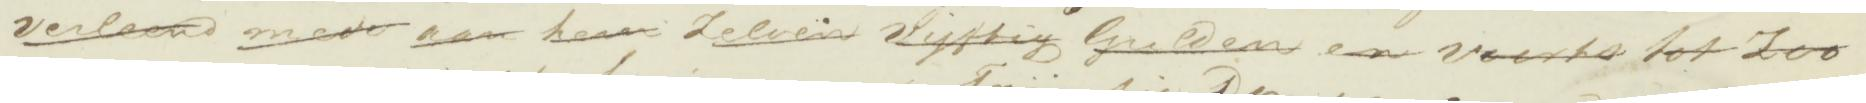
verleend mede aan hem zelven Vyftig Gulden en voorts tot zoo
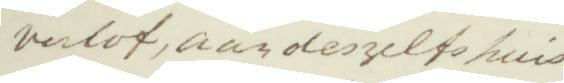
verlof, aan deszelfs huis
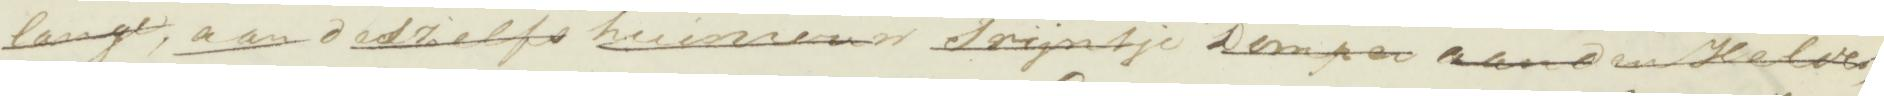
lange, aan deszelfs huisvrouw Trijntje Domper aan den Helder
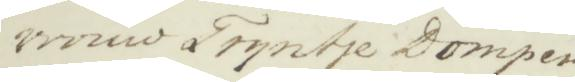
vrouw Tryntje Domper
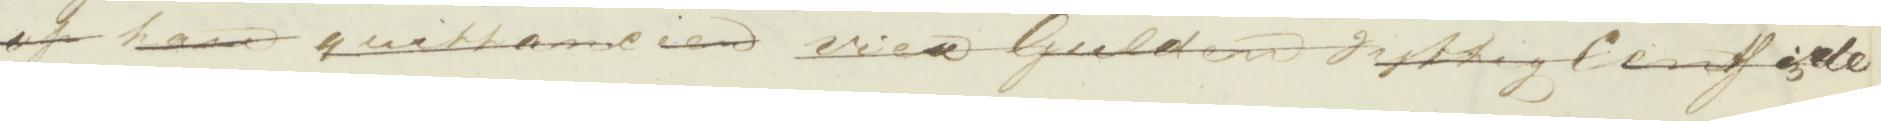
op hare quittancien vier Gulden Vyftig Cents in de
